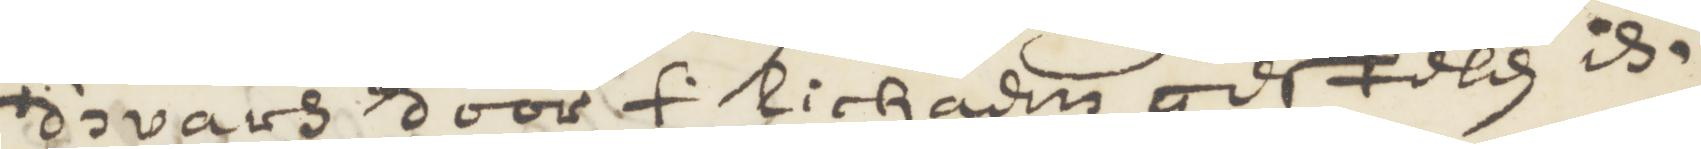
dwars door t' lichaem gesteken is.
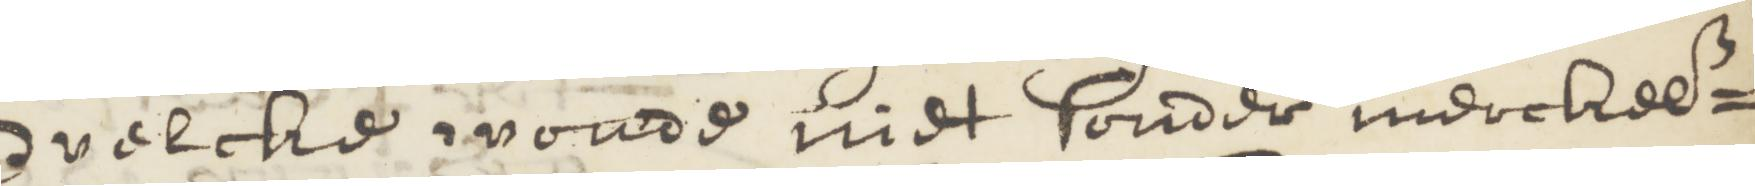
welcke wonde niet sonder merckelijk
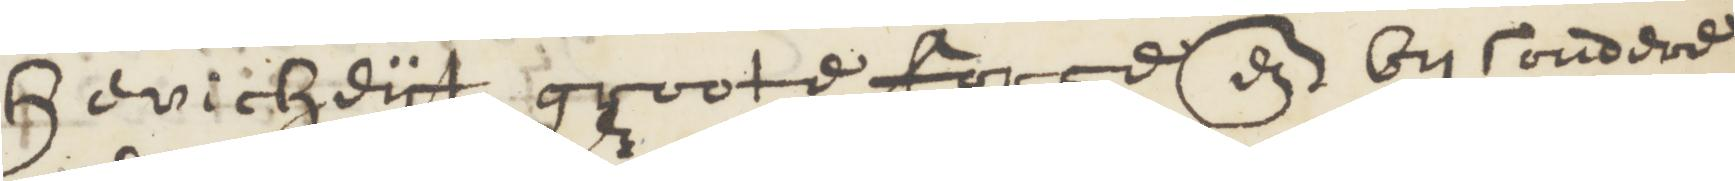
hevicheijt groote force ende bysondere
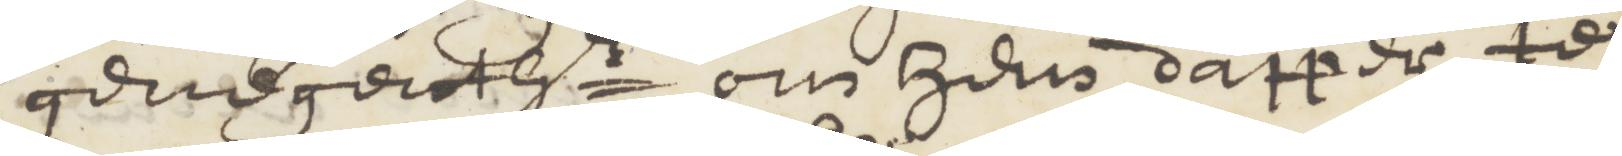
genegenth=t om hem dapper te
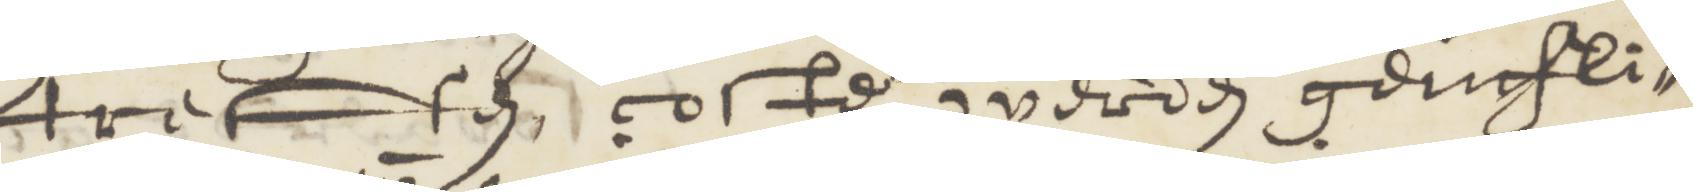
treffen coste werden geinfli„
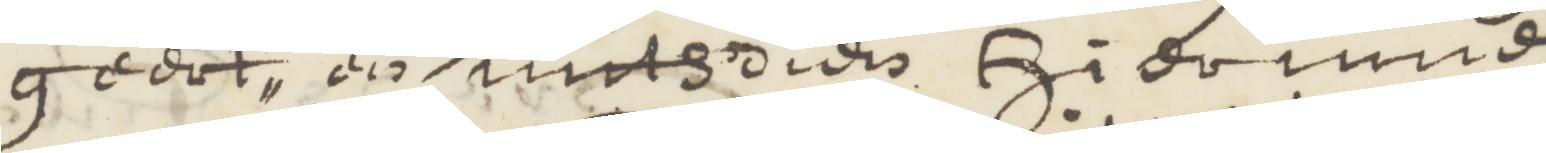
geert„ en mitsdien hier inne
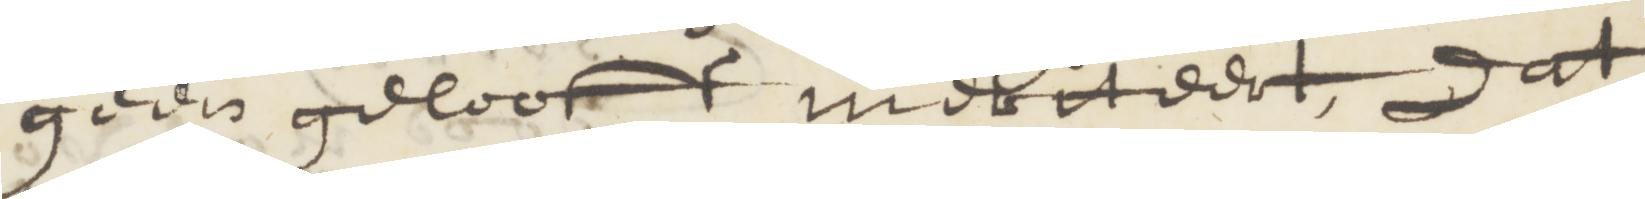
geen gelooft meriteert, Dat
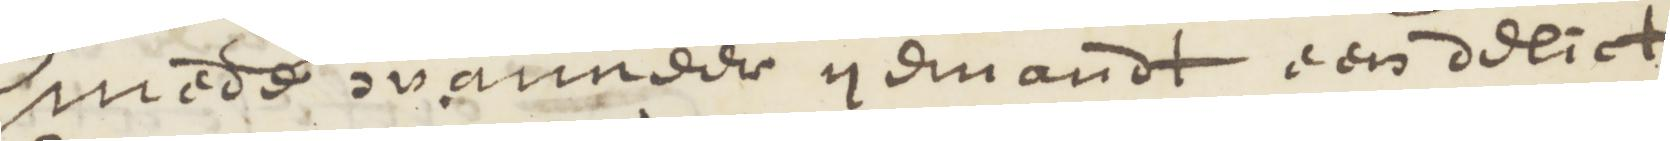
mede wanneer yemandt een delict
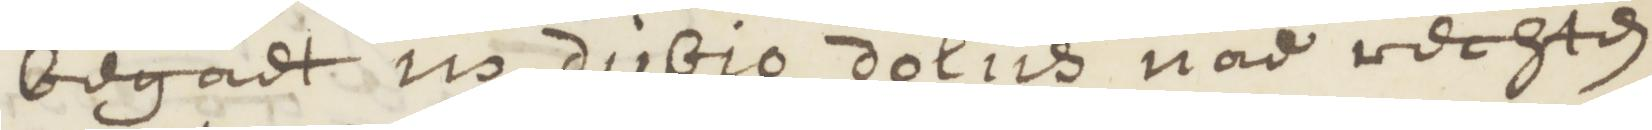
begaet in dubio dolus nae rechten
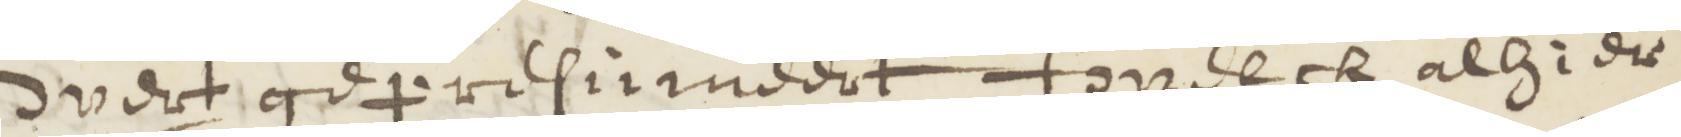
wert gepresumeert sowelck alhier
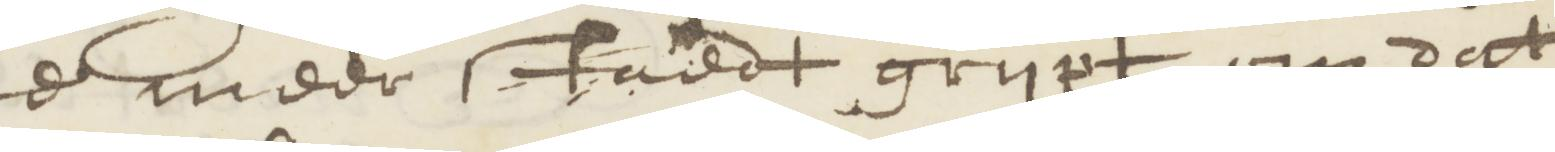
te meer staedt grijpt, om dat
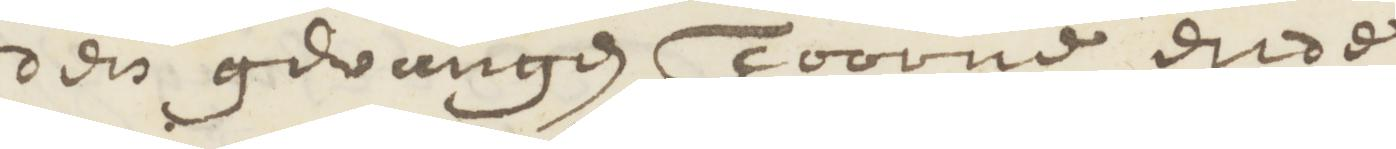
den gevangen Coorne ende
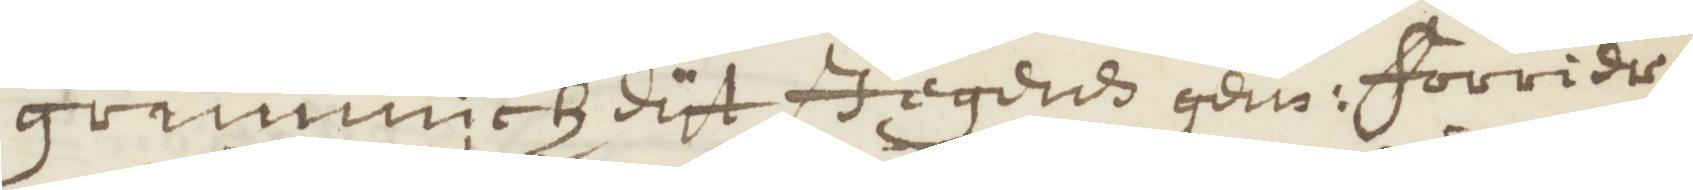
grimmicheijt Jegens gem: forrier
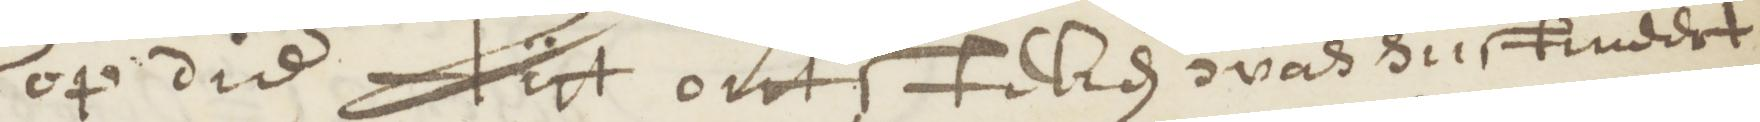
op die tijt ontsteken was sustineert
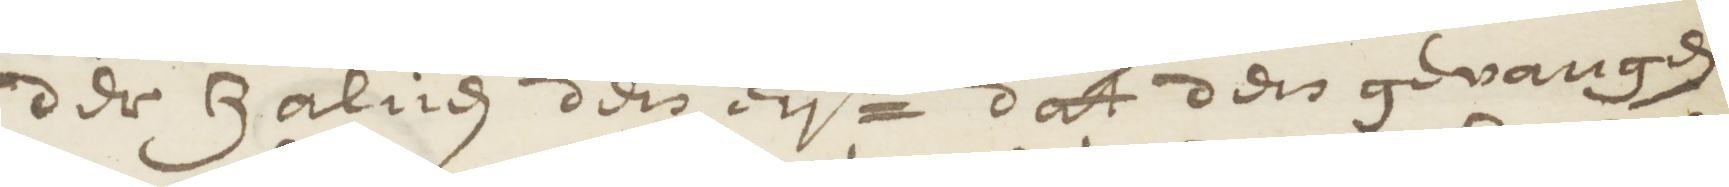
der halue den eij=r dat den gevangen
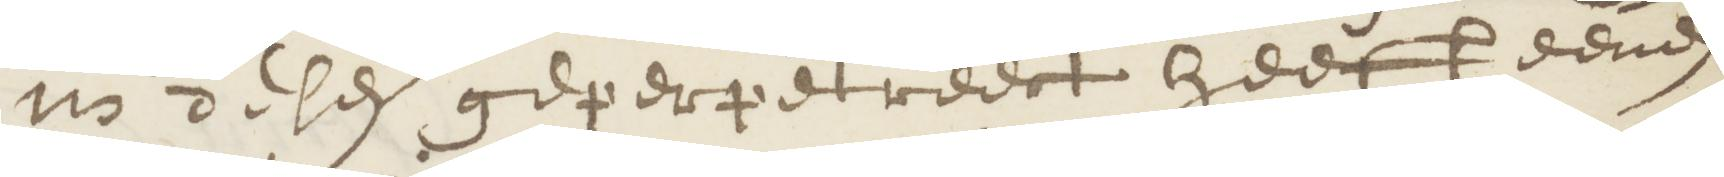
in dese geperpetreert heeft eenen
